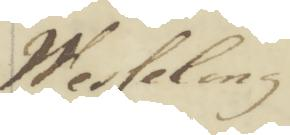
Wesseling
